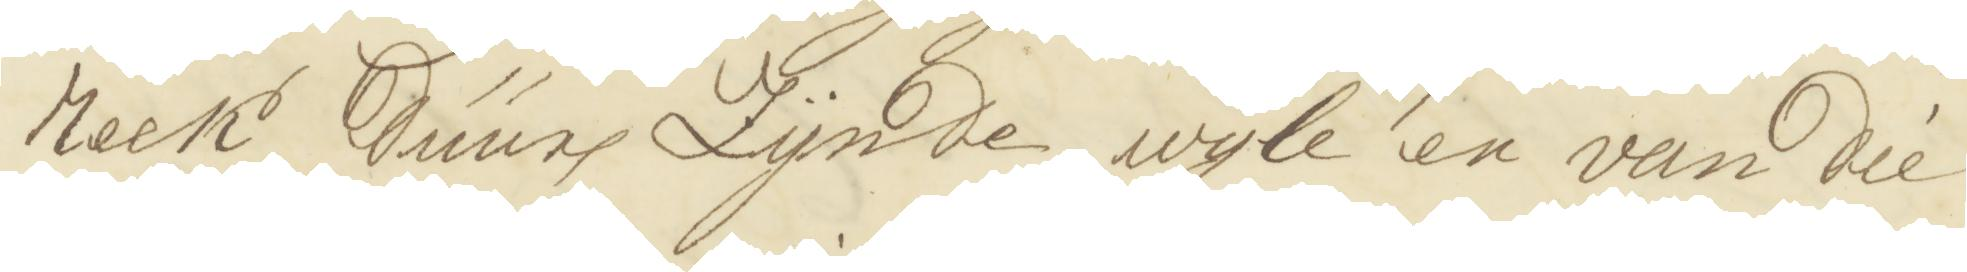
reek duur zijnde, wijle er van die
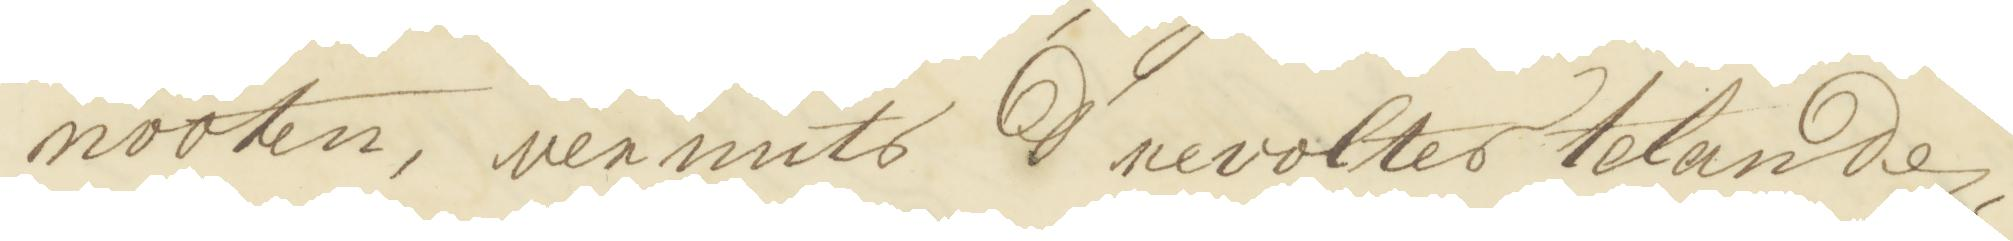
nooten, vermits d’ revoltes telande,
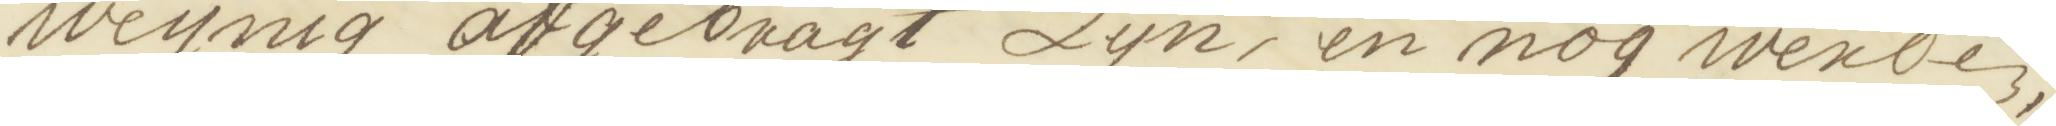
weijnig afgebragt zijn, en nog werden,
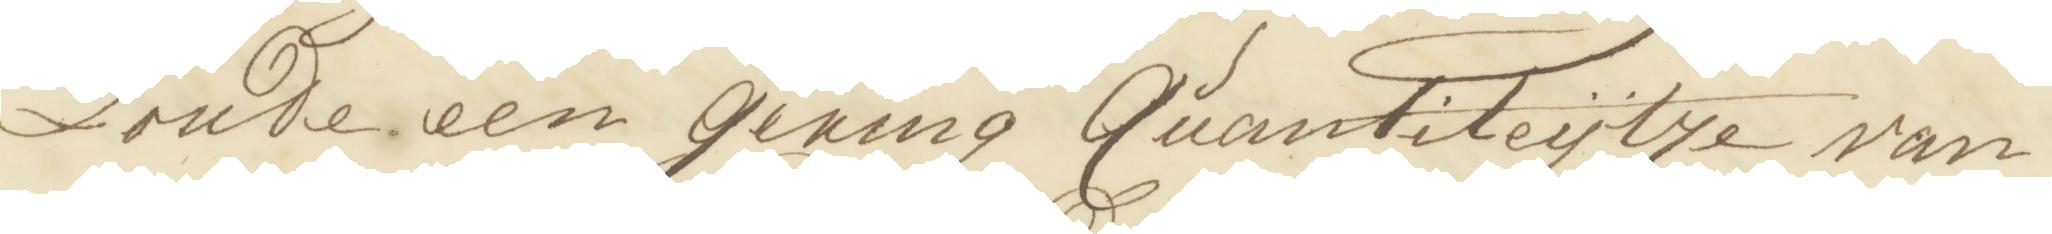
zoude een gering Quantiteijtje van
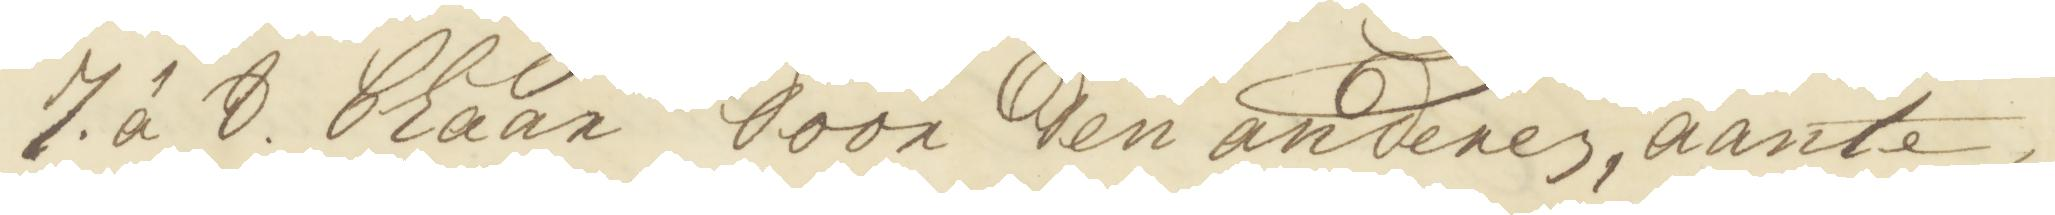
7. â 8. bhaar door den anderen, aante,
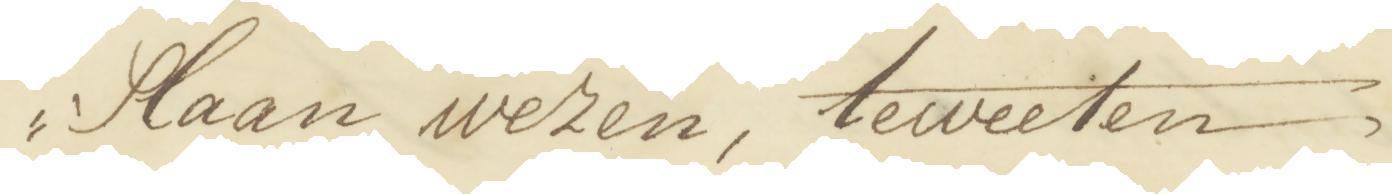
„slaan wezen, teweeten
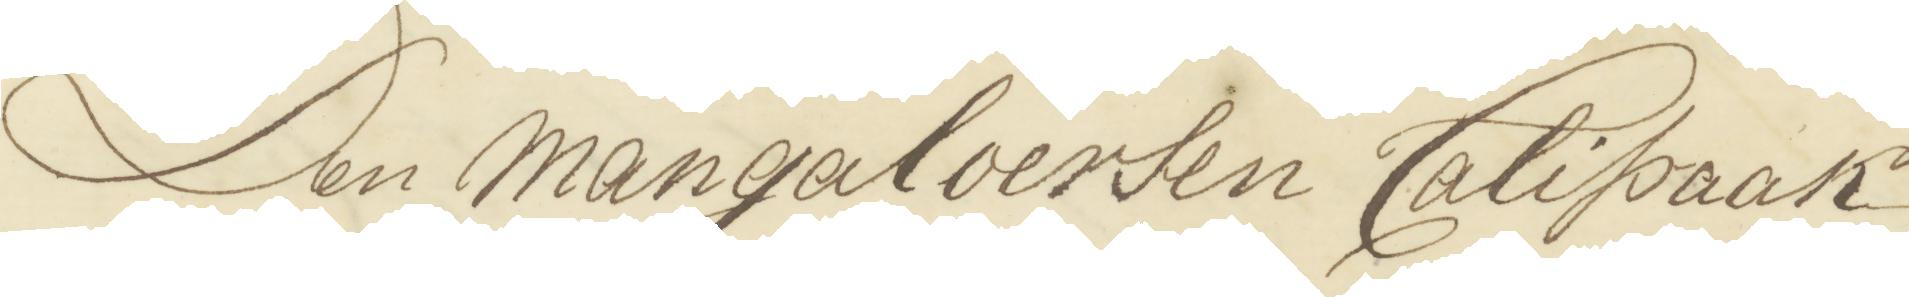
Den mangaloersen Calipaak
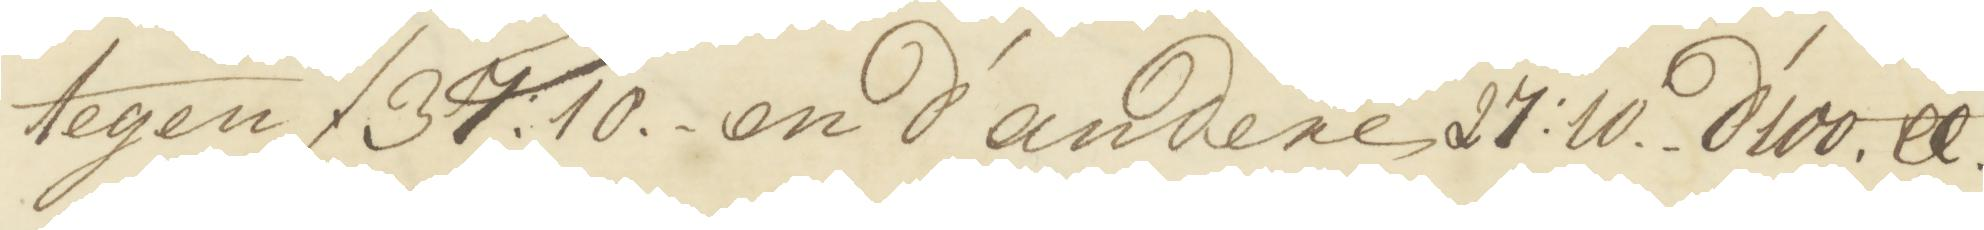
tegen ƒ 37: 10. - en d’andere 27: 10. - d'100. lb.
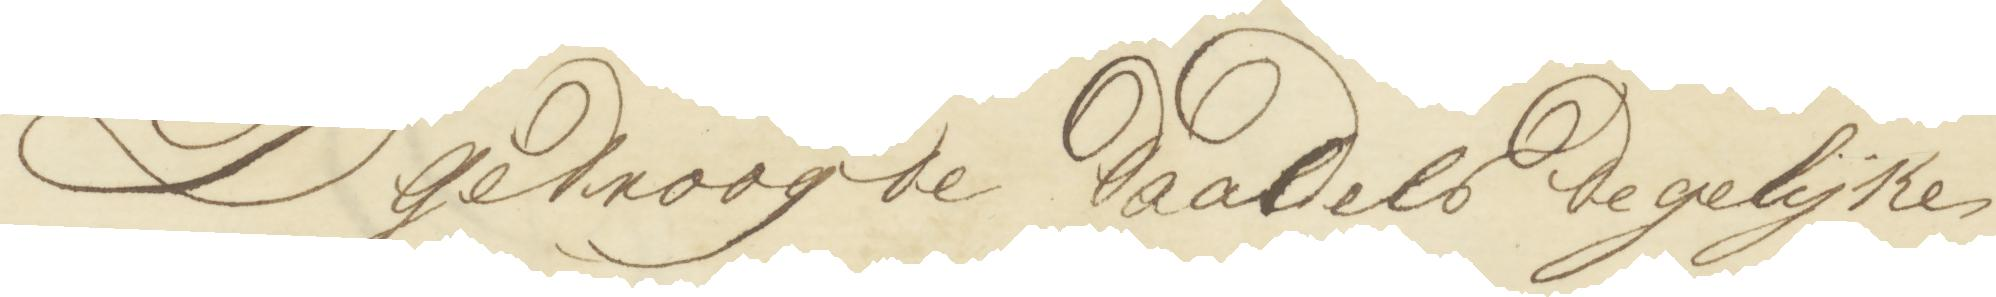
D' gedroogde daadels de gelijke
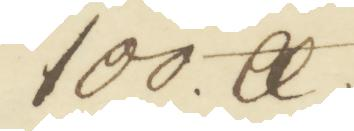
100. lb.
